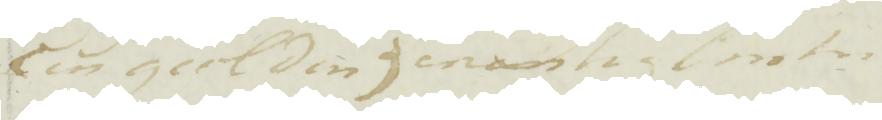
Een gulden zeventig Cents
